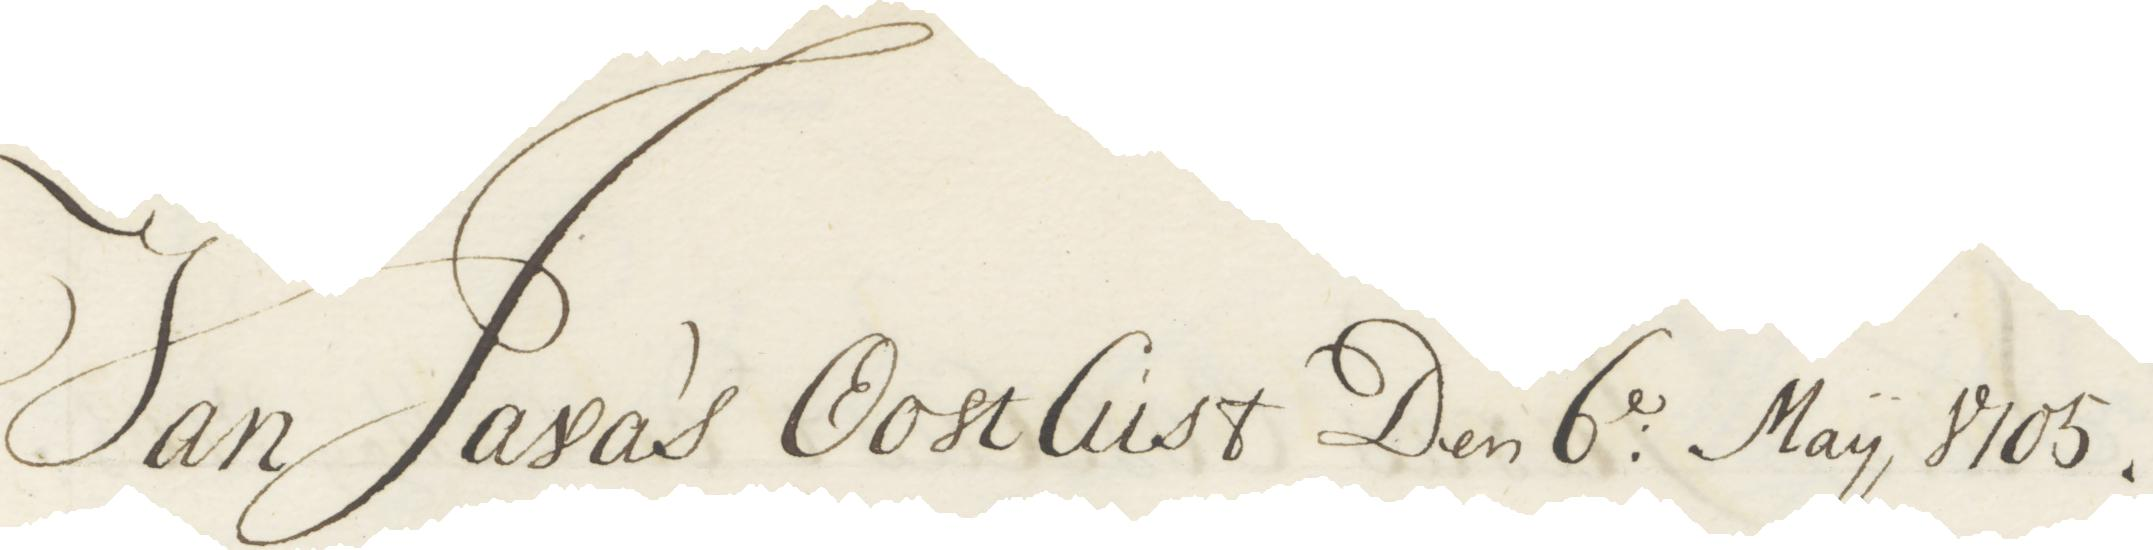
Van Java's Oost Cust Den 6:e Maij 1705.
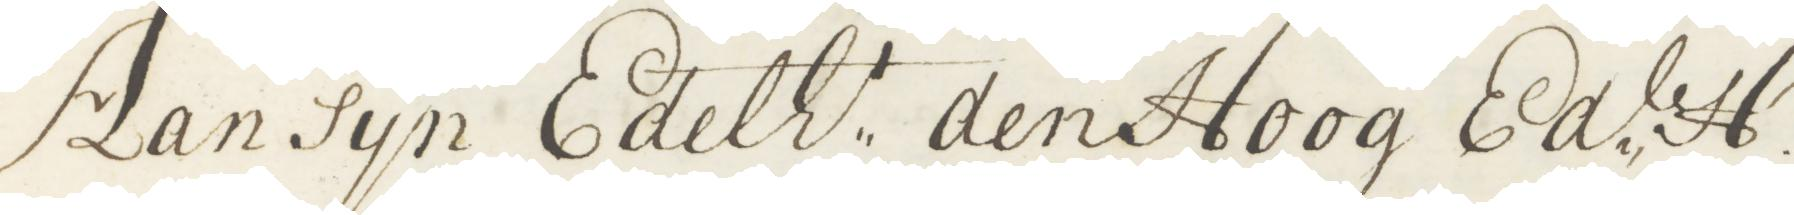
Aan sijn Edelh„t den Hoog Ed„le H:e
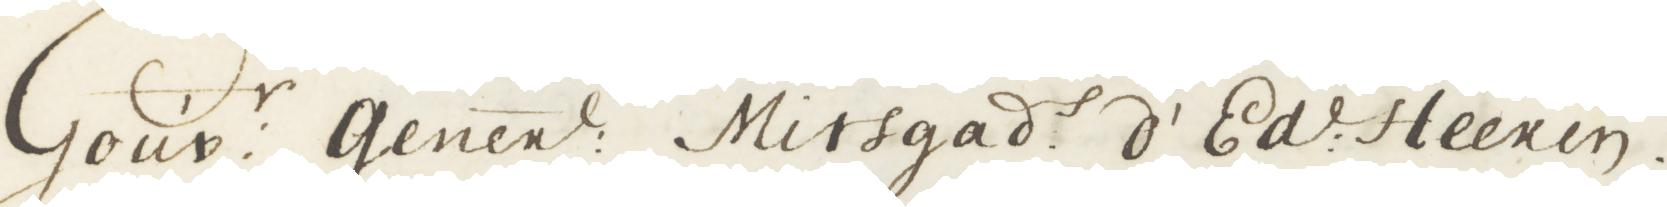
Gouv:r gener:l Mitsgad:s d’Ed:e Heeren
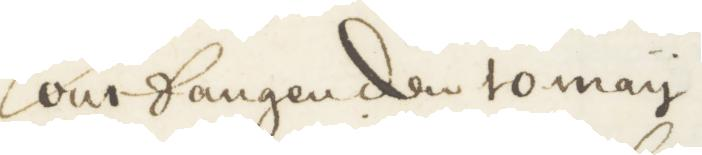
ontfangen den 10 maij
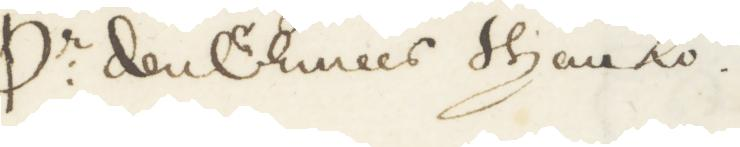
:r den Chinees tsjanko.
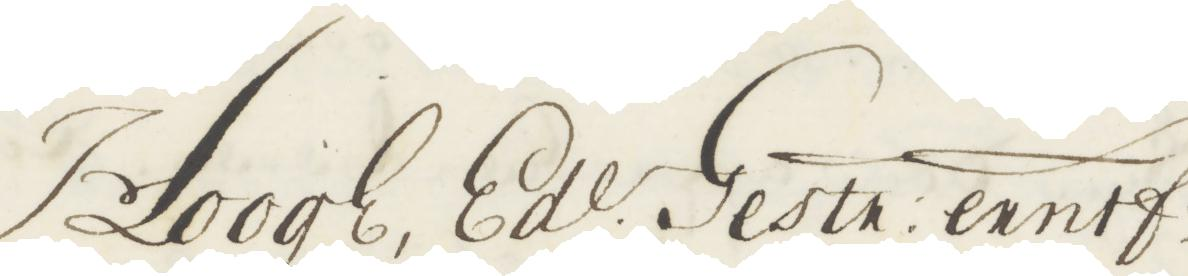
Hoogh, Ed:e Gestr: erntf
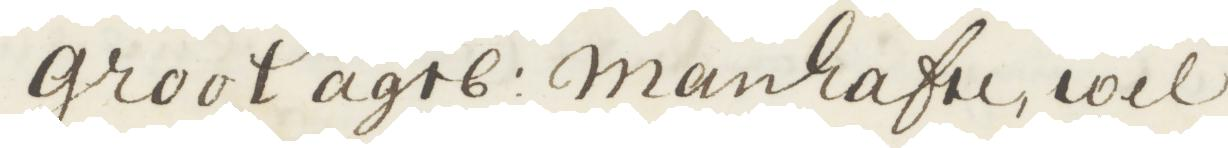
groot agtb: manhafte, wel
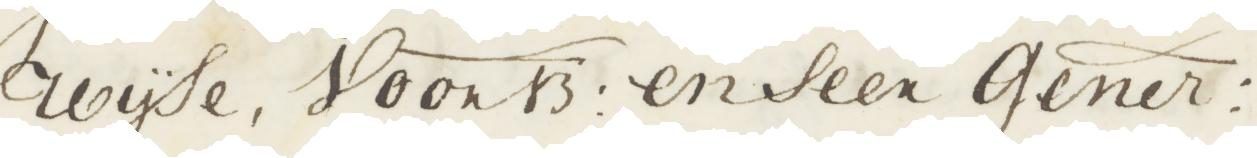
wijse, Voors: en seer gener.
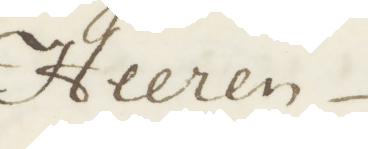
Heeren —
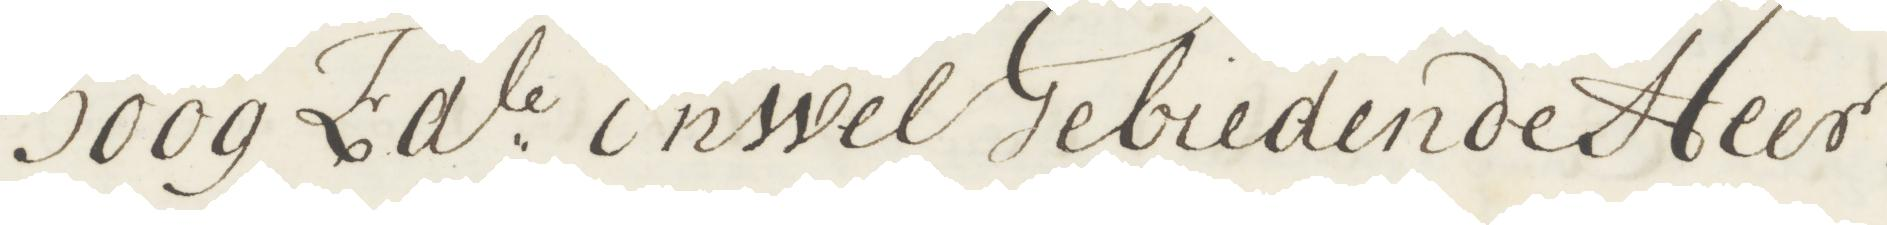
Hoog Ed„le En wel Gebiedende Heer
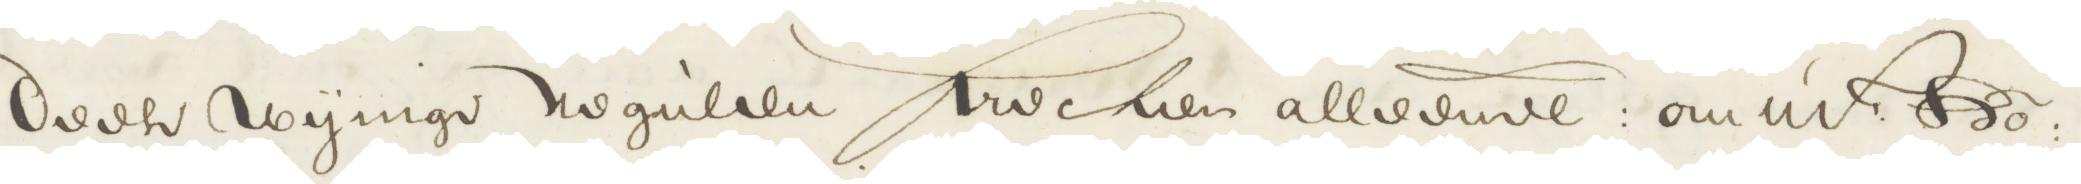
deese wijnige regulen strecken alleenel: om uE: Ho:
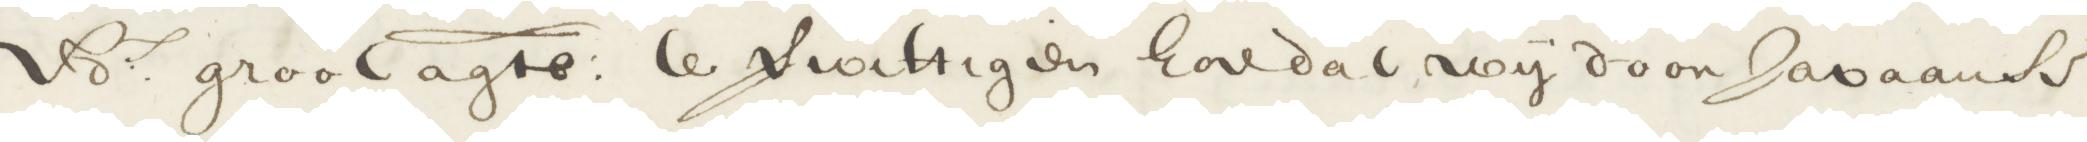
Ed:s groot agtb: te verwittigen hoe dat wij door Javaanse
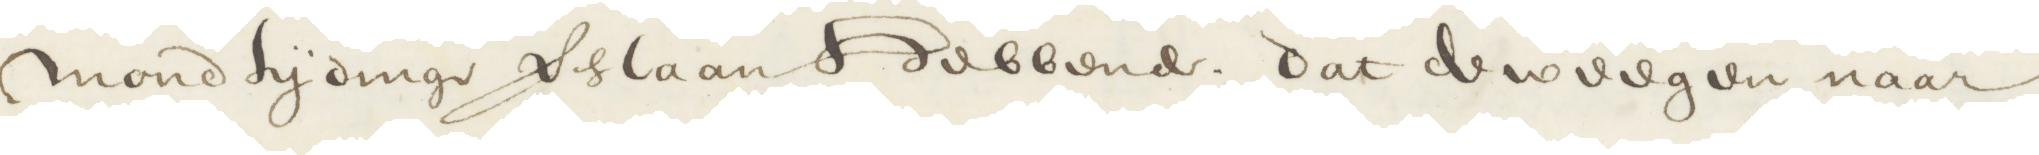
mond tijdinge verstaan Hebbende, dat de weegen naar
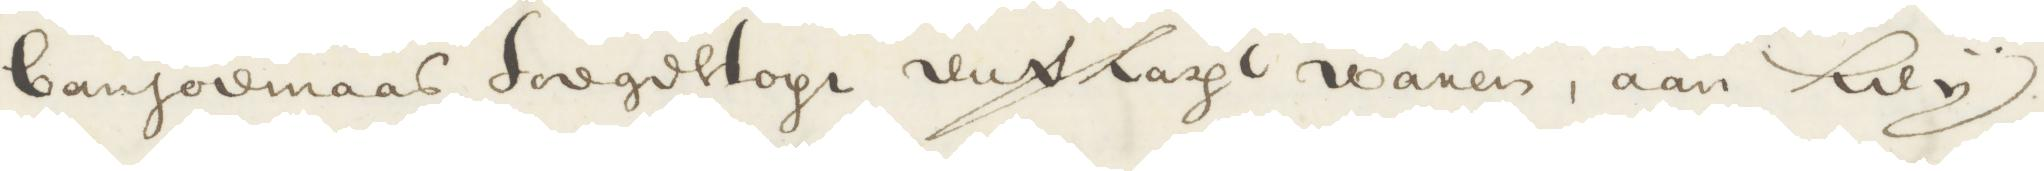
banjoemaas toegestopt en verkapt waren, aan seij
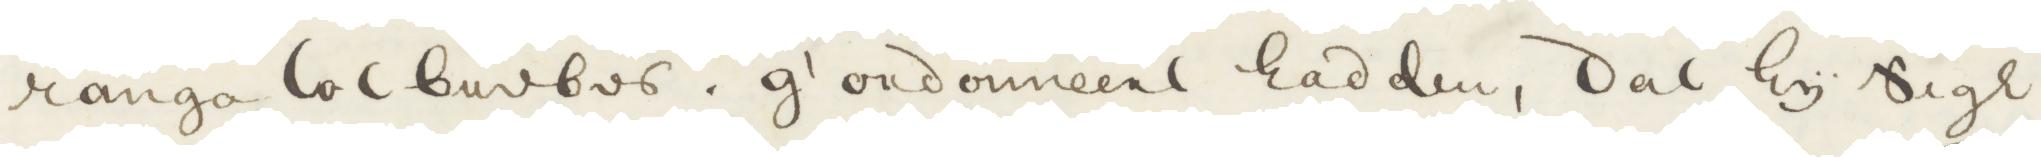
rango tot brebes, g’ordonneert hadden, dat hij sigh
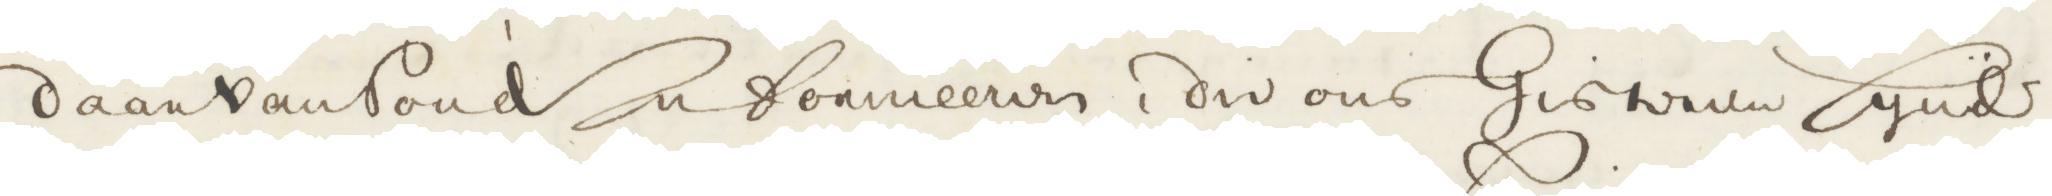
daar van soud Jnformeeren, die ons Gisteren Sijnde
